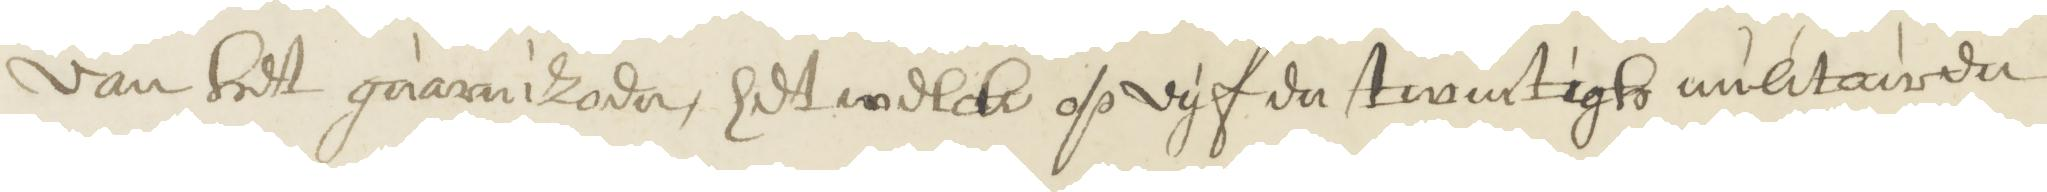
van het guarnizoen, hetwelck op vijf en twintigh militairen
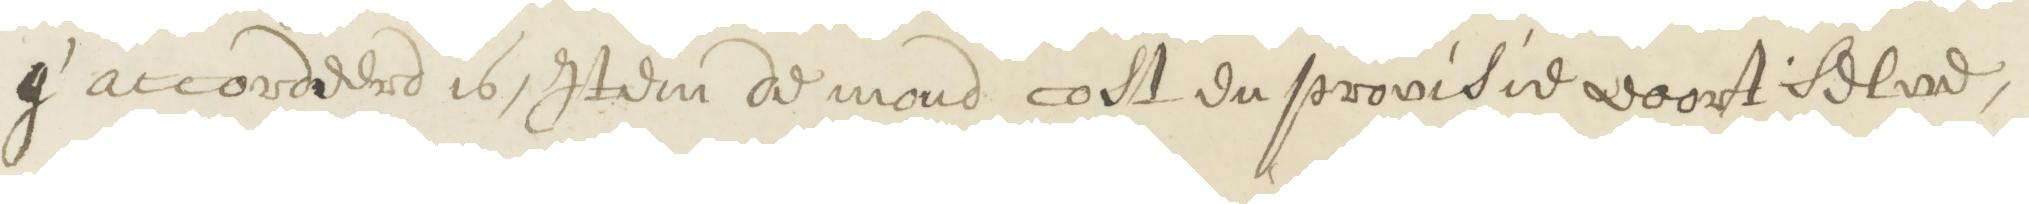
g’ accordeerd is, Jtem de mond cost en provisie voor t'selve,
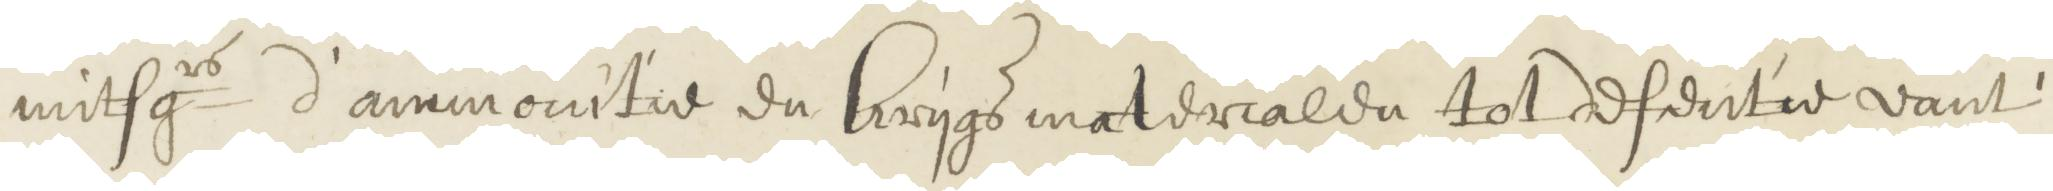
mitsg=rs d’ammonitie en krijgs materialen tot defentie vant'
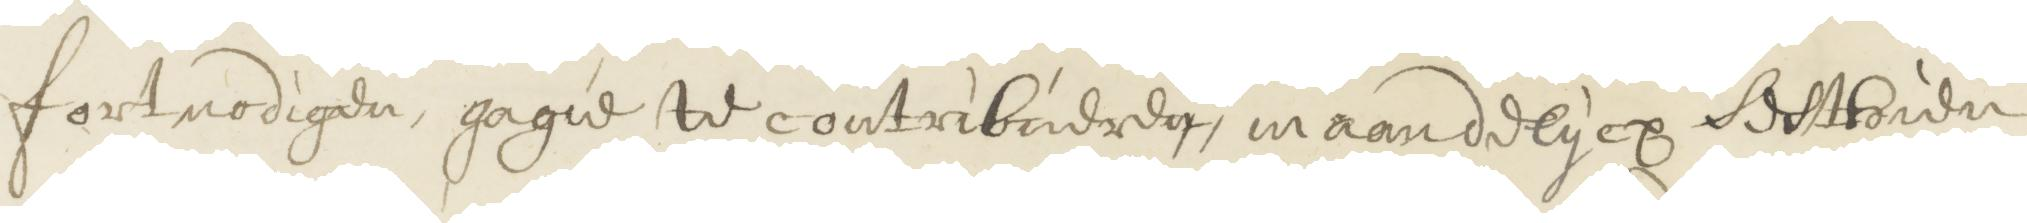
fort nodigen, gagie te contribueren, maandelijcx sesthien
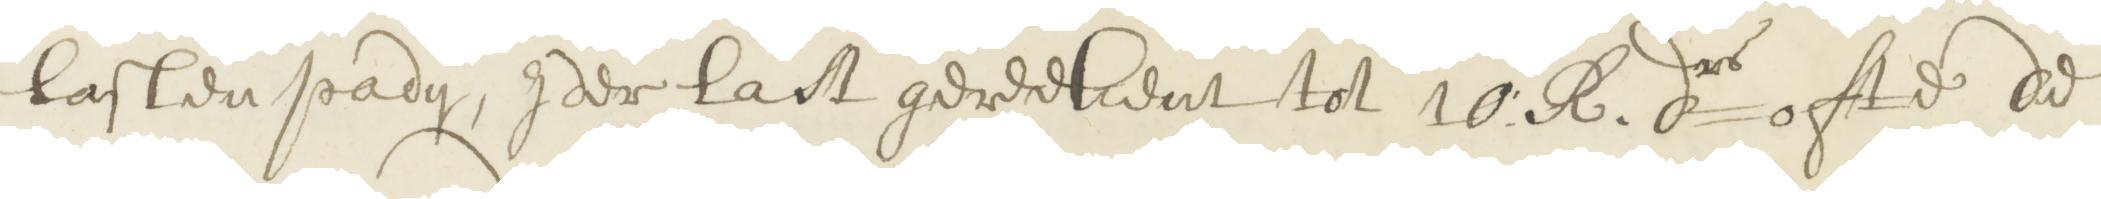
lasten padij, Jder last gereekent tot 10: R. d=rs ofte de
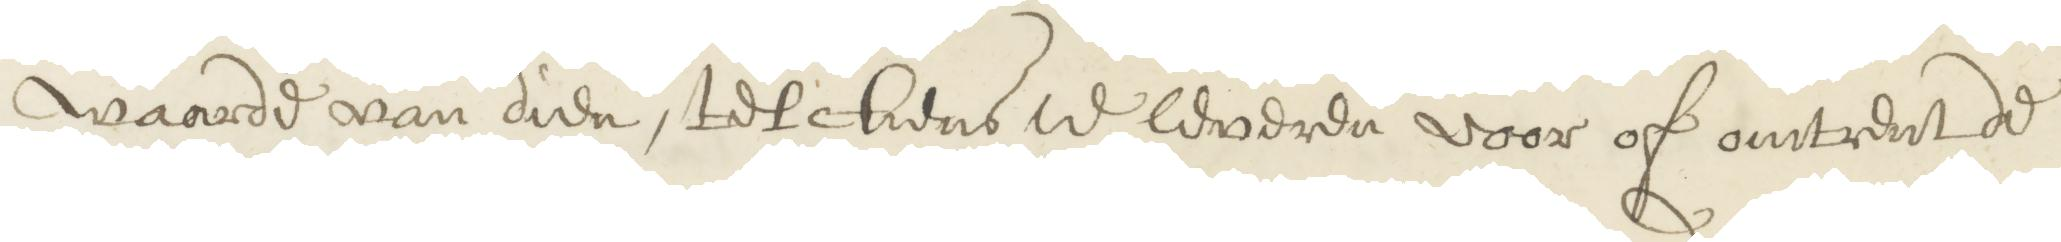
waarde van dien, telckens te leveren voor of omtrent de
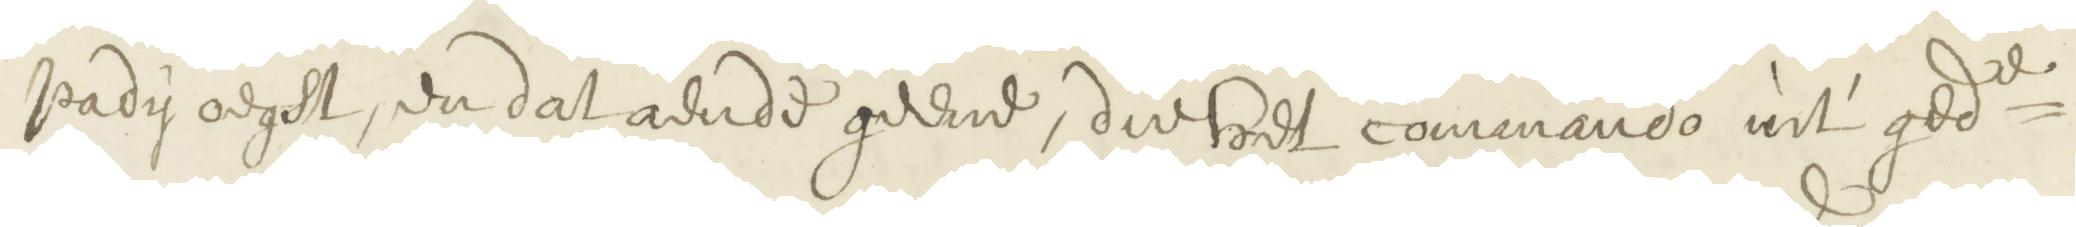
padij oegst, en dat aende geene, die het commando int' ged=e
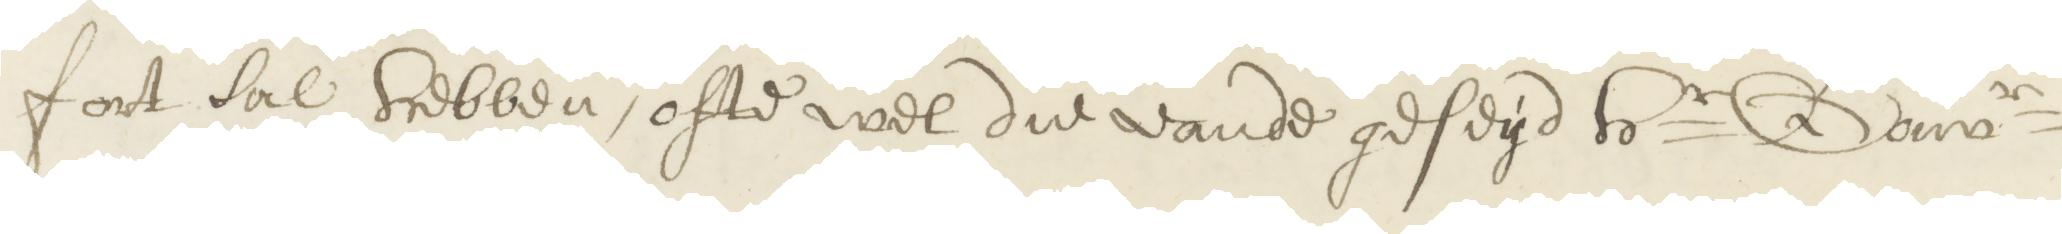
fort sal hebben, ofte wel die vande geseijd h=r Gouv=r
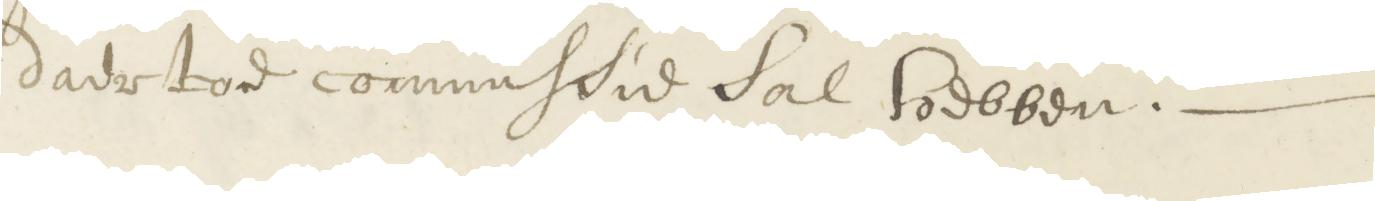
daer toe commissie sal hebben. —
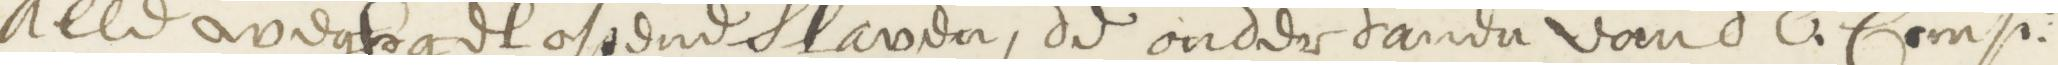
alle wegh gelopene slaven, de onderdanen van d’ E: Comp:e
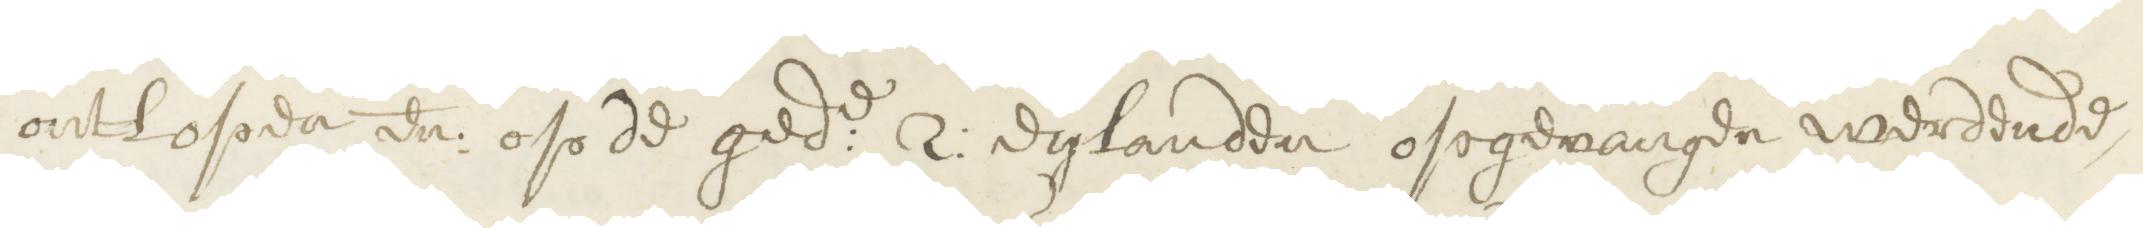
ontlopen en: op de ged:e 2: eijlanden opgevangen werdende,
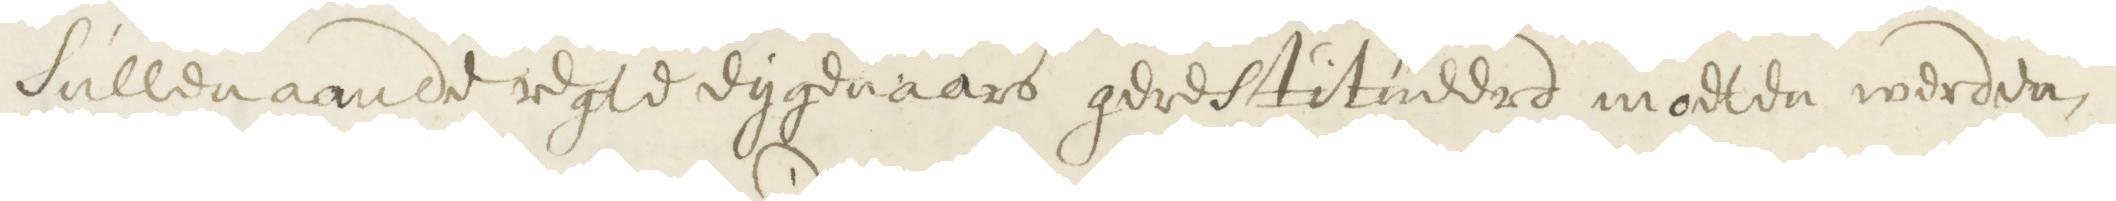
sullen aan de regte eijgenaars gerestitueerd moeten werden,
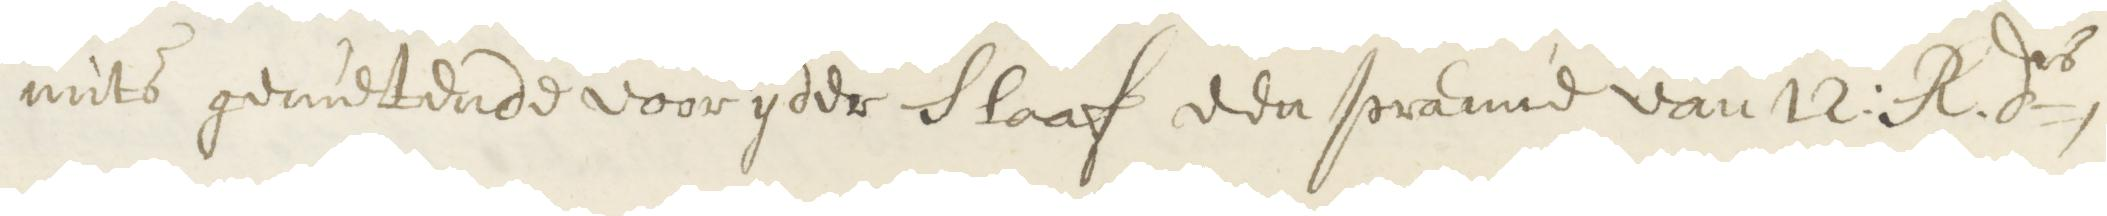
niets genietende voor ijder slaaf een pramie van 12: R. d=rs,
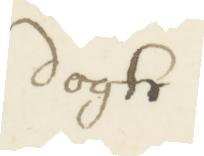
dogh
